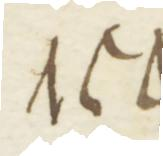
154.
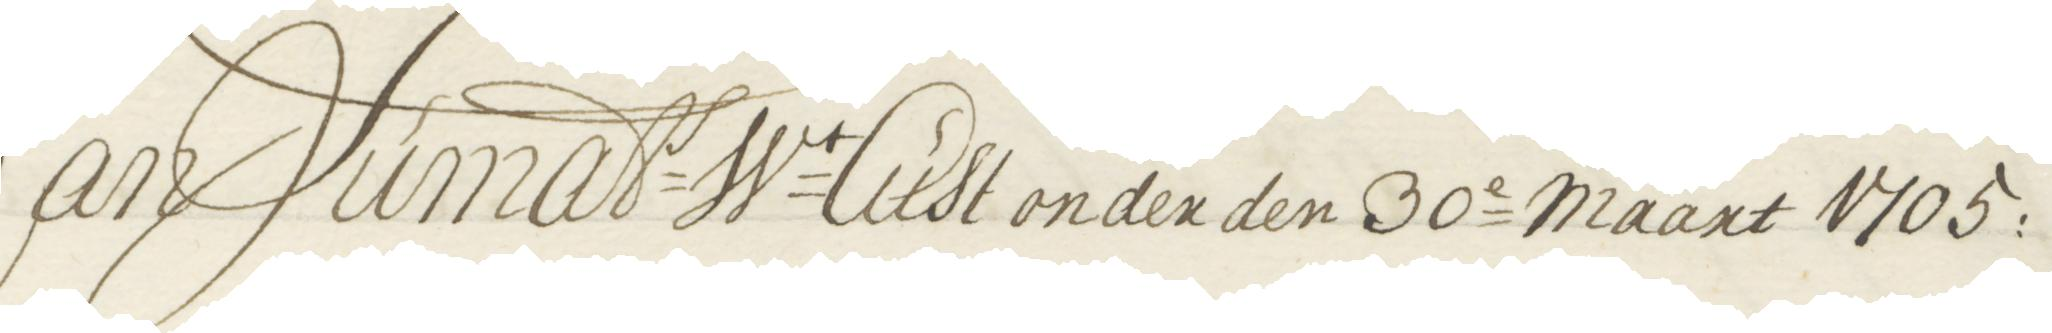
Van Sumat=s W=t Cust onder den 30=e Maart 1705:
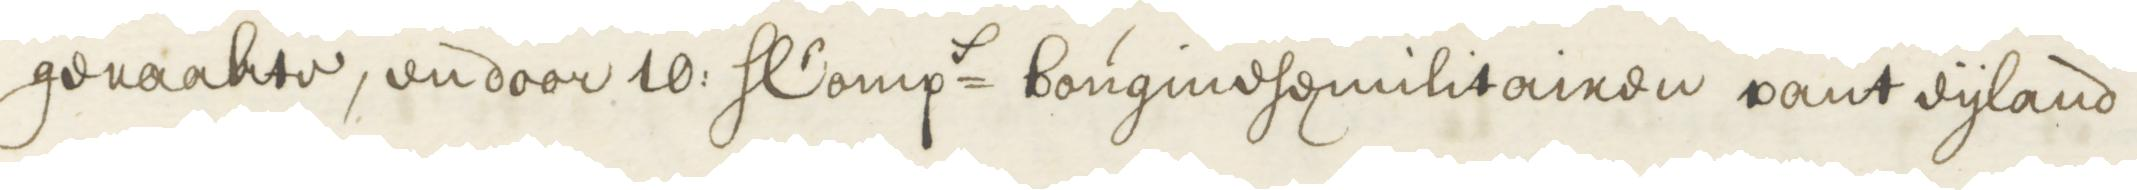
geraakte, en door 10: 'sComp=s bouginese militairen van't eijland
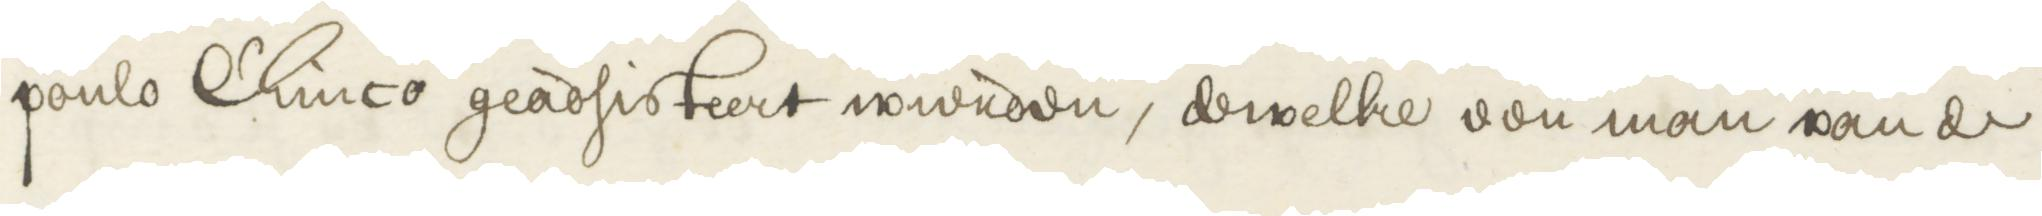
poulo Chinco geadsisteert wierden, dewelke een man van de
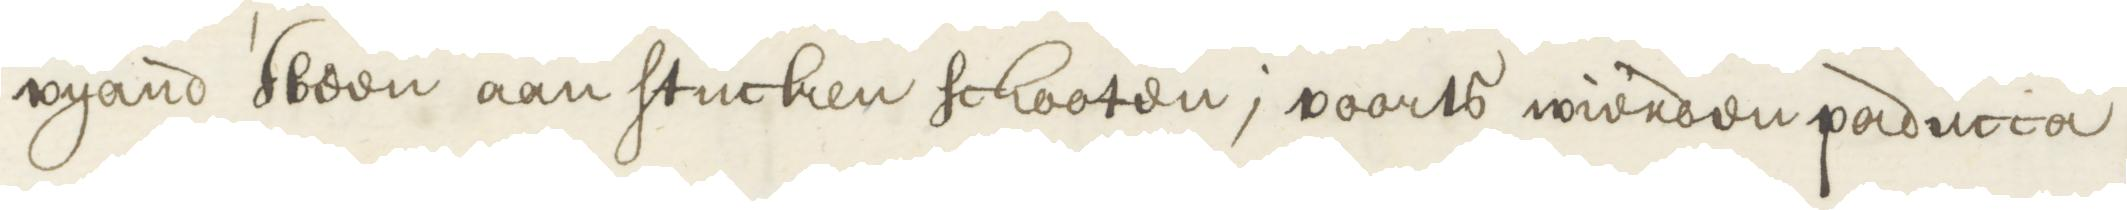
vijand 't been aan stucken schooten; voorts wierden paducca
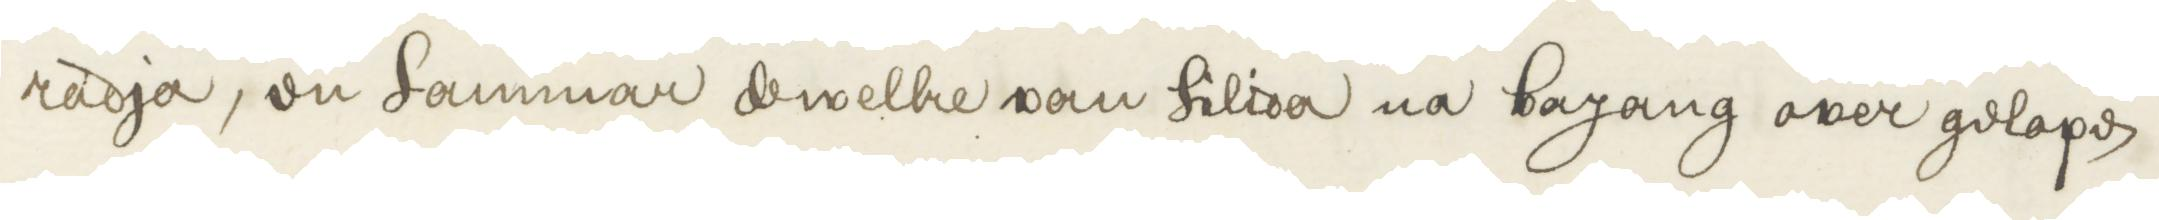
radja, en sammar dewelke van silida na bajang over gelopen
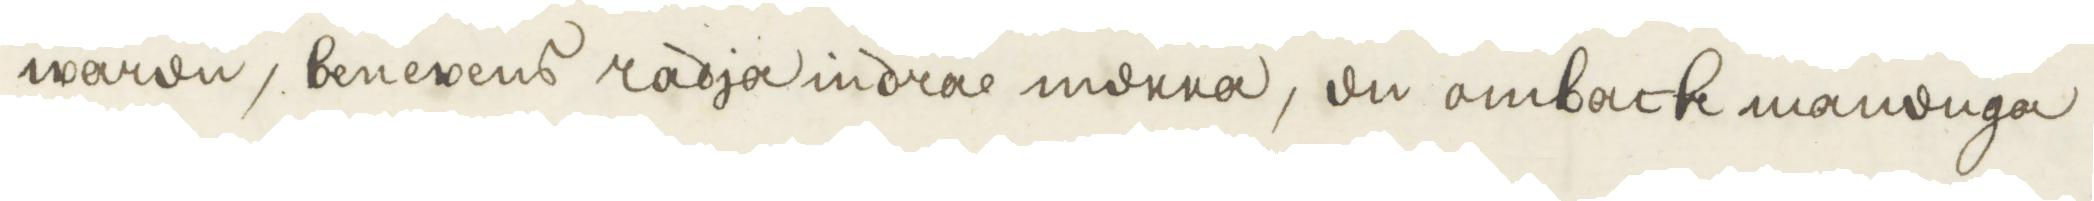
waren, benevens radja indrae merra, en omback manenga
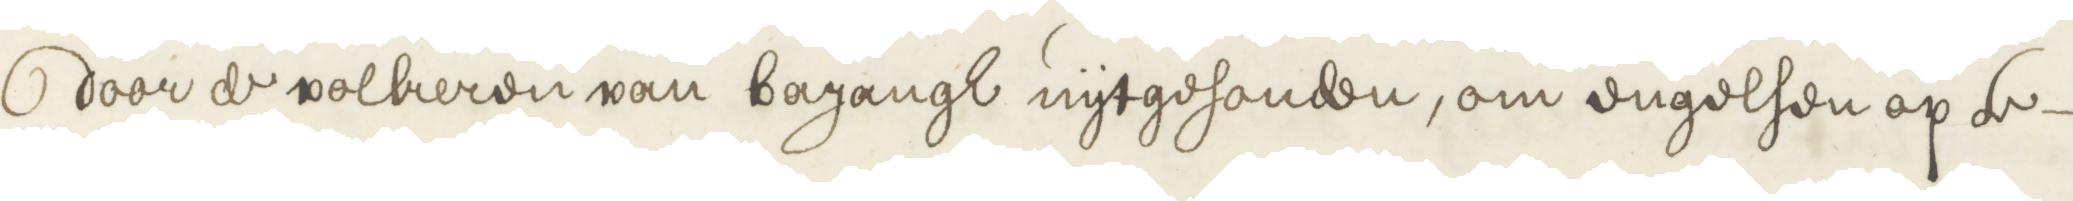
door de volkeren van bajangh uijtgesonden, om engelsen op te
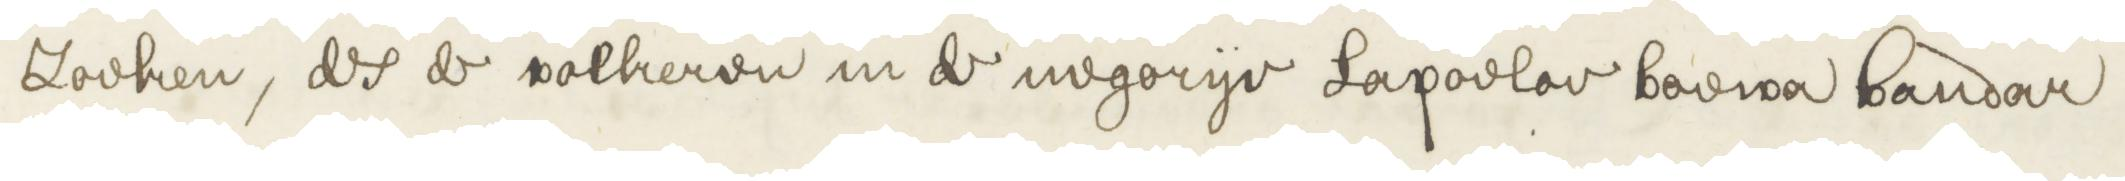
zoeken, des de volkeren in de negorije sapoeloe boewa bandar
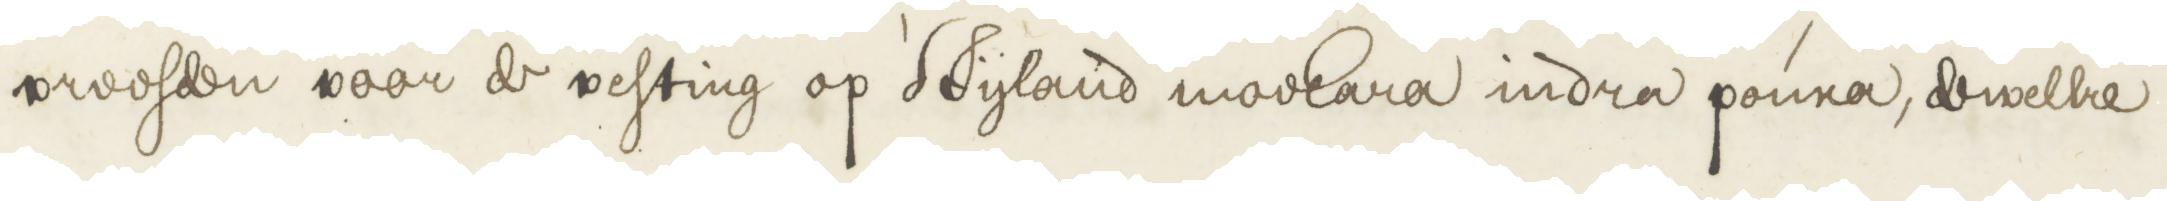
vreesden voor de vesting op 't Eijland moehara indra poura, dewelke
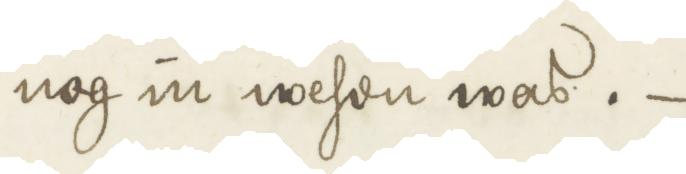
nog in wesen was.
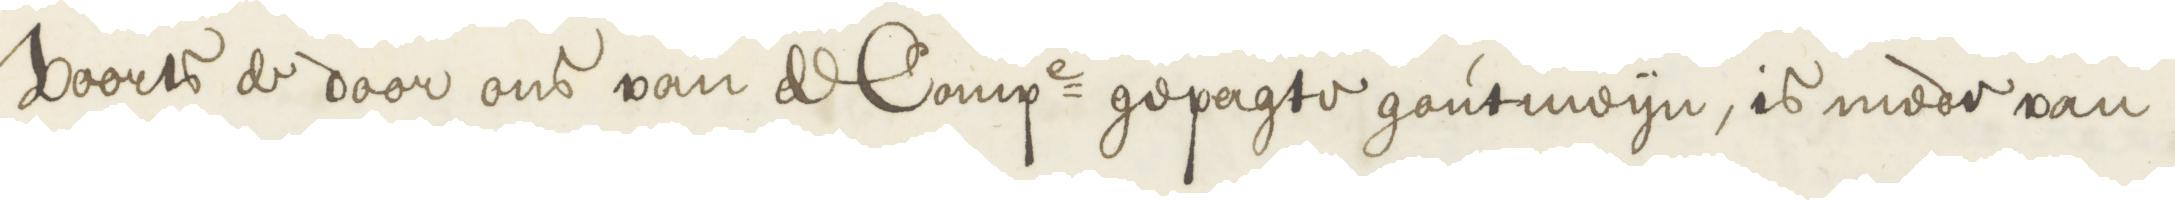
Voorts de door ons van de Comp=e gepagte goutmeijn, is mede van
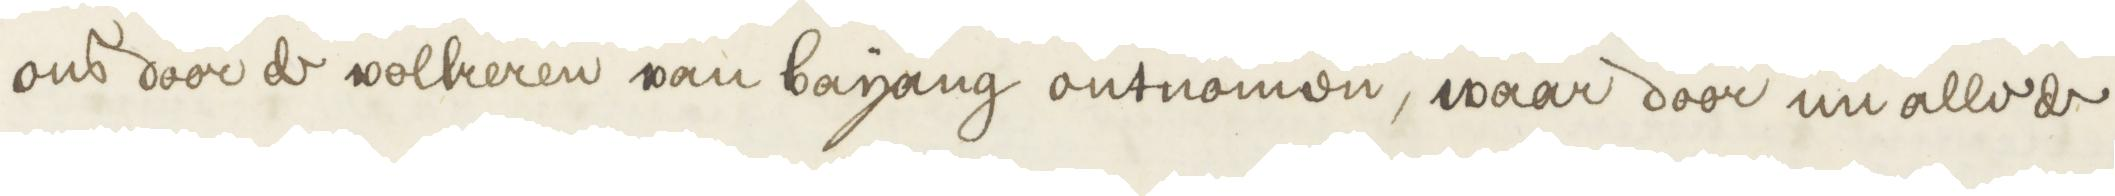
ons door de volkeren van baijang ontnomen, waar door nu alle de
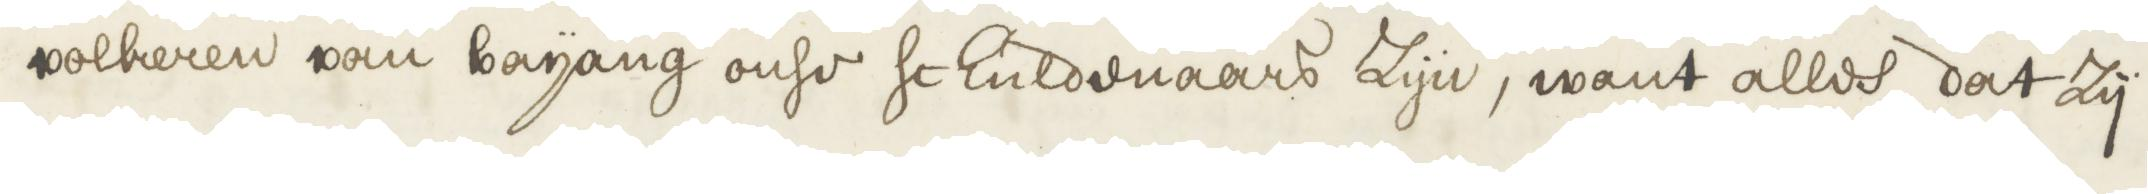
volkeren van baijang onse schuldenaars zijn, want alles dat zij
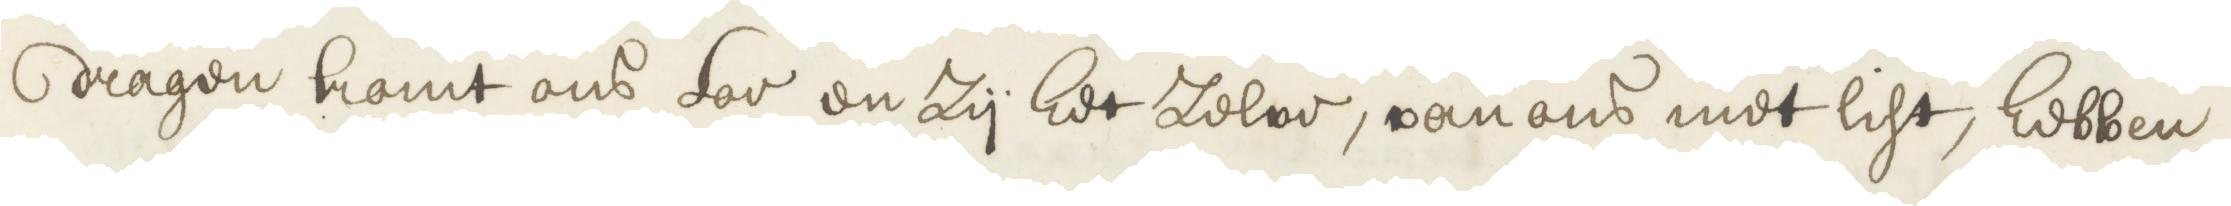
dragen komt ons toe en zij het zelve, van ons met list, hebben
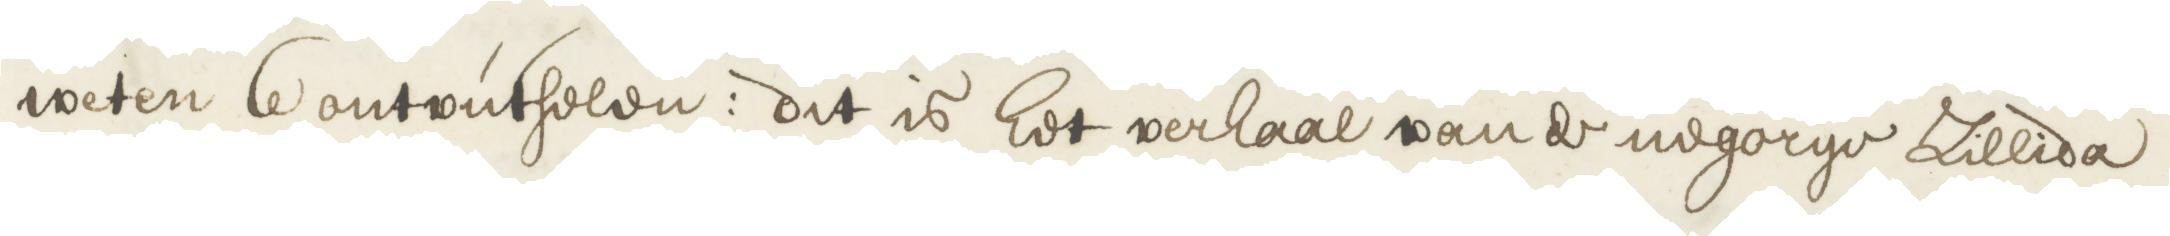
weten te ontvutselen: dit is het verhaal van de negorije zillida
